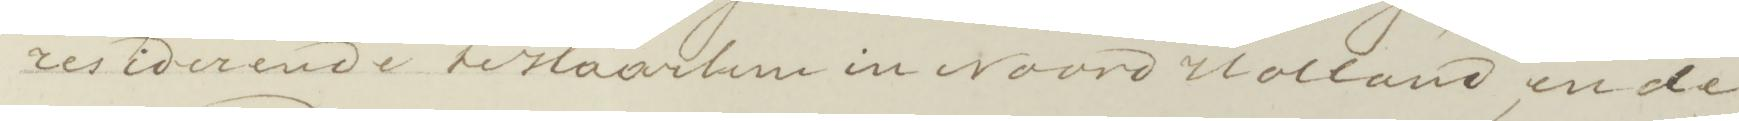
residerende teHaarlem in Noord Holland, en de
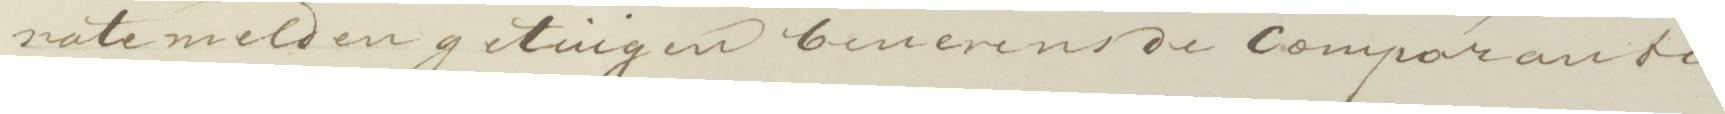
nate melden getuigen benevens de comparante
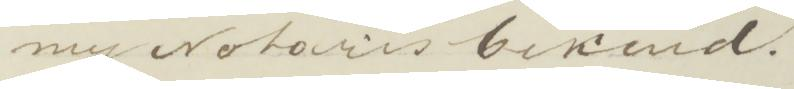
my Notaris bekend.
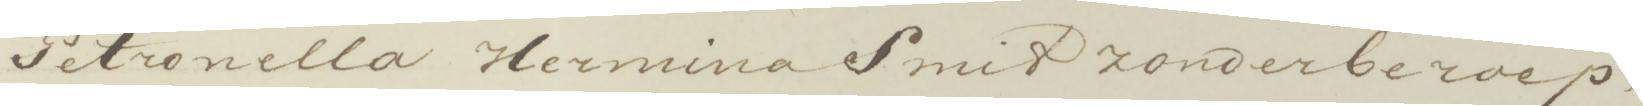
Petronella Hermina Smit zonder beroep,
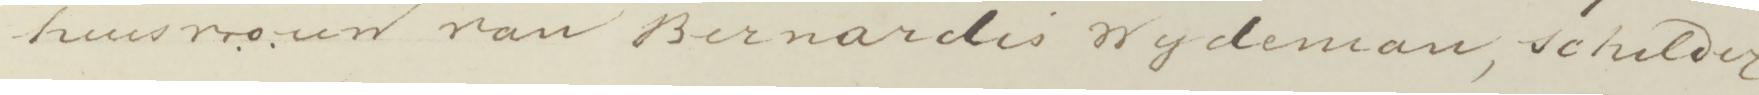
huisvrouw van Bernardis Wydeman, schilder
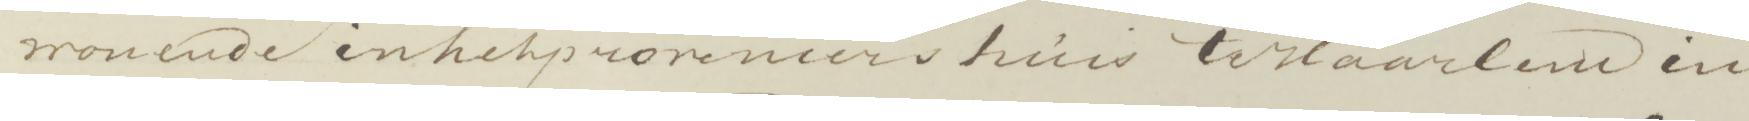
wonende in hetproveniers huis teHaarlem in
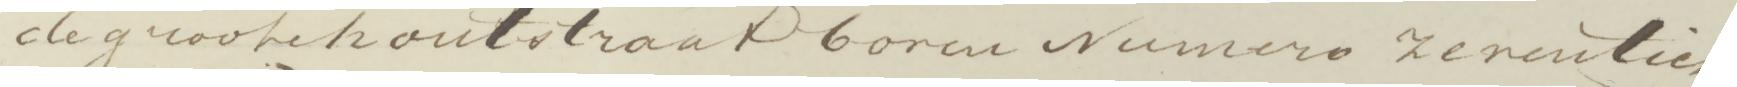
de grootehoutstraat boven Numero zeventien
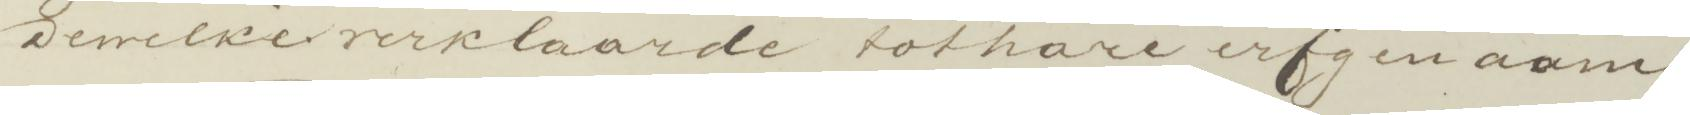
Dewelke verklaarde tothare erfgenaam
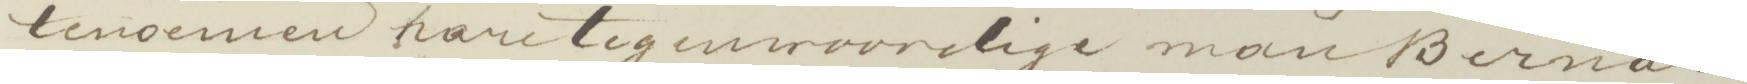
tenoemen hare tegenwoordige man Bernar
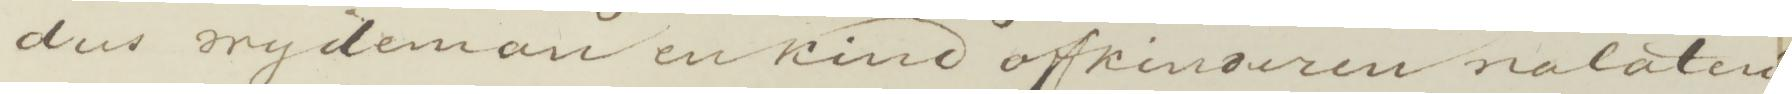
dus wydeman en kind ofkinderen nalaten
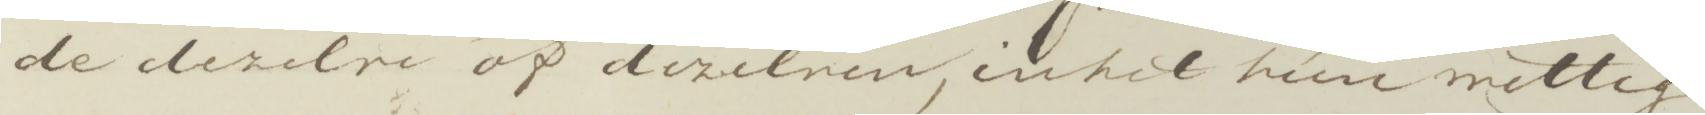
de dezelve of dezelven, inhet hun wettig
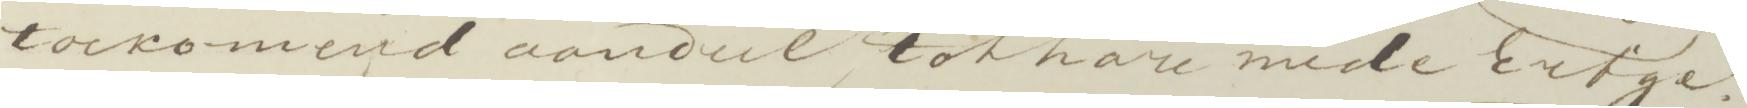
toekomend aandeel tothare mede Erfge„
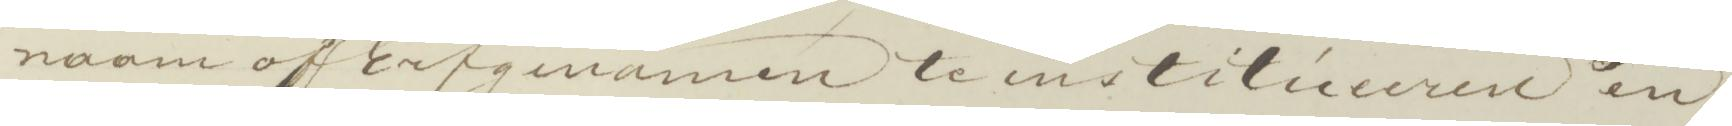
naam of Erfgenamen te institueeren en
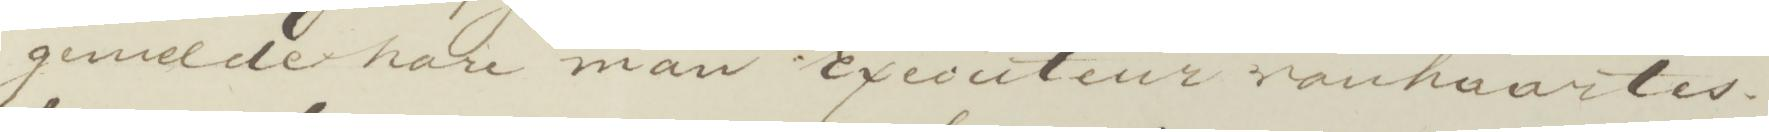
gemelde hare man Executeur vanhaar tes-
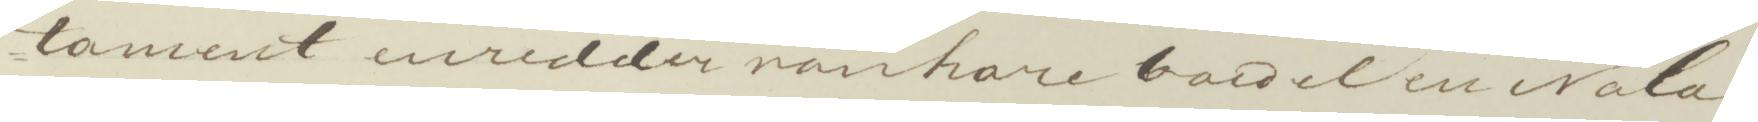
„tament enredder vanhare boedel en Nala,
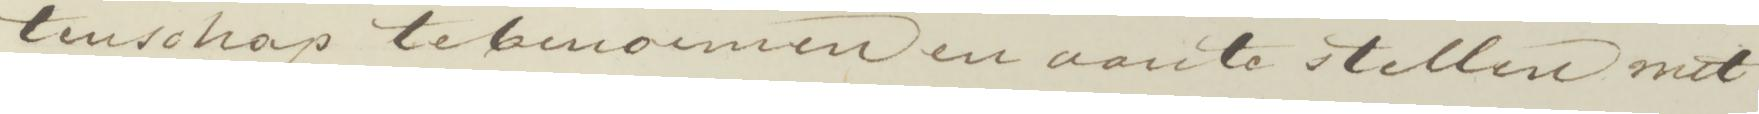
tenschap tebenoemen en aan te stellen met
